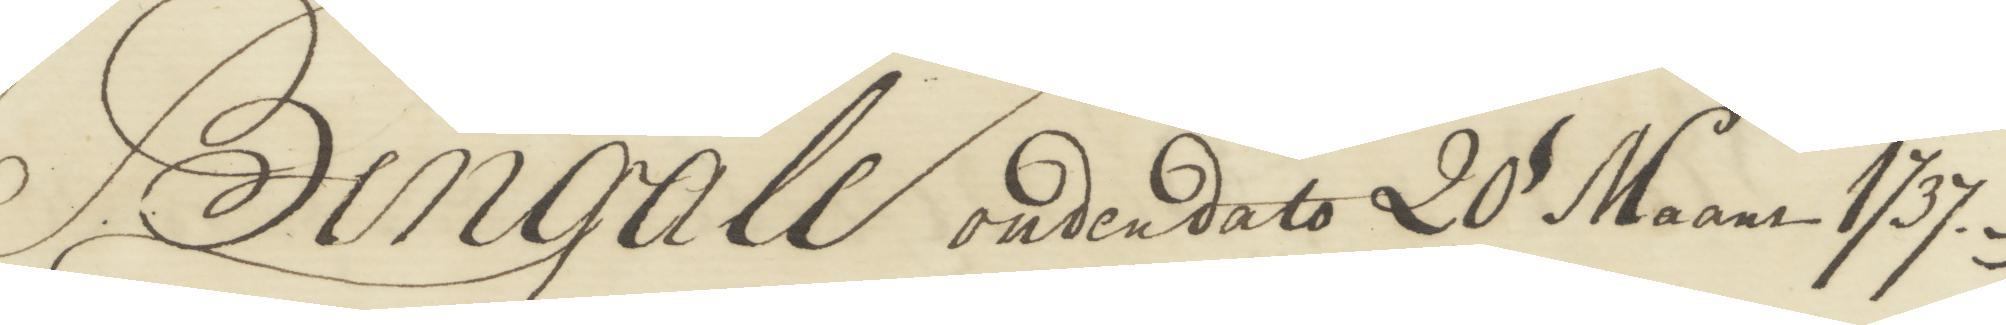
Van Bengale onderdato 20' Maart 1737.
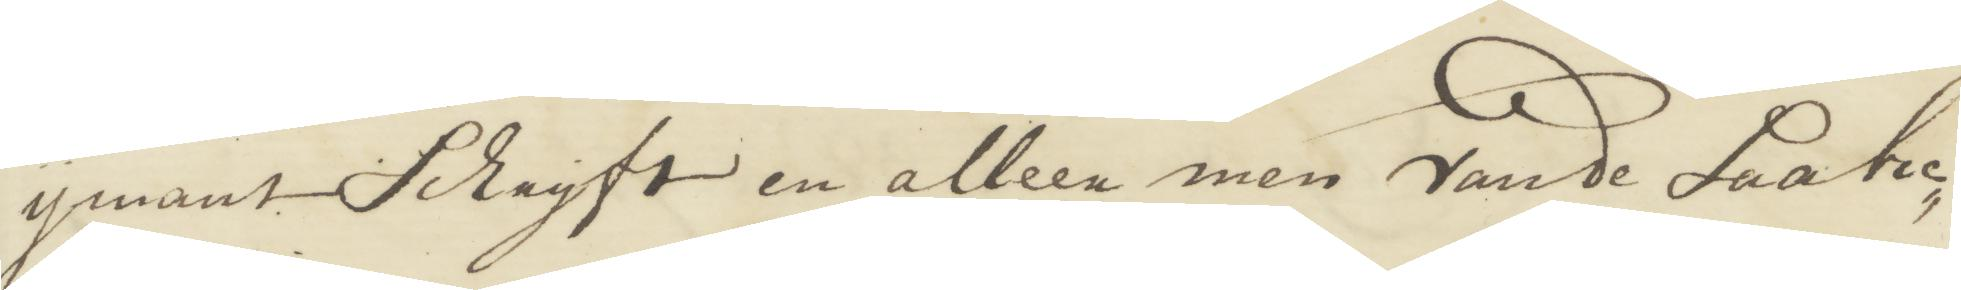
ijmant schrijft en alleer men van de saake„
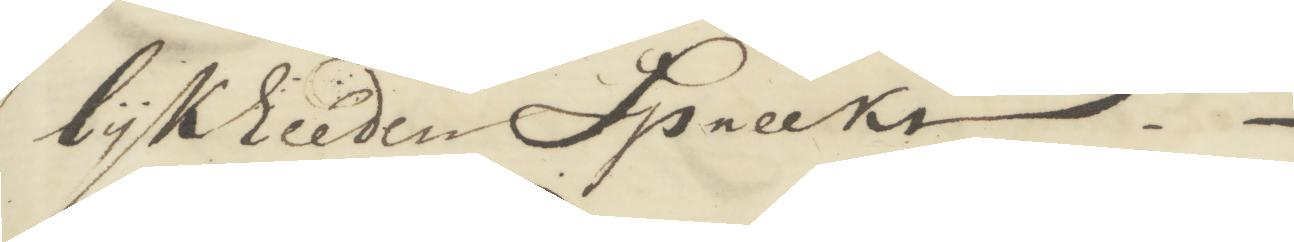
lijkheeden spreekt-
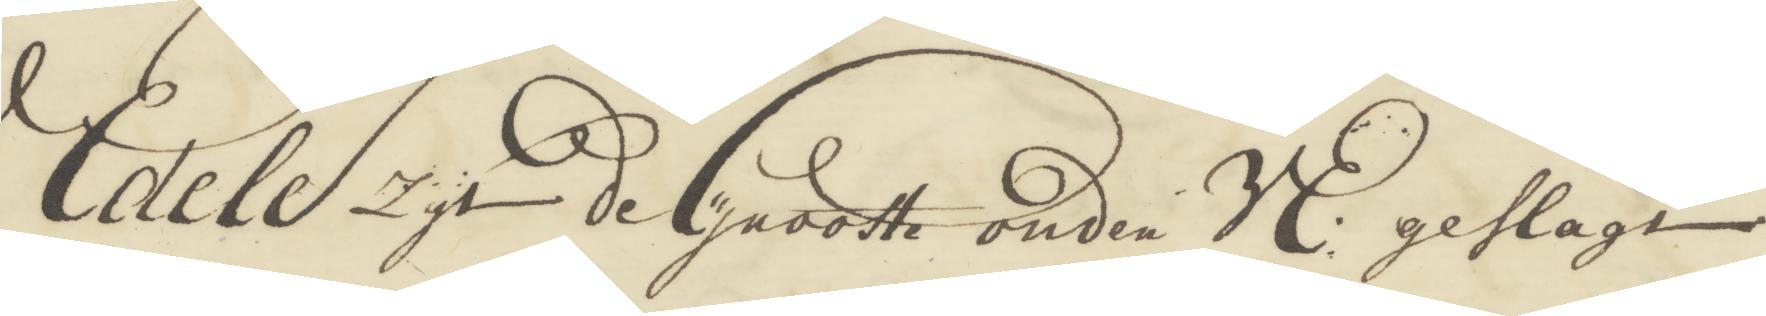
VEdeles zijn de Grootte onder VE: geslagt
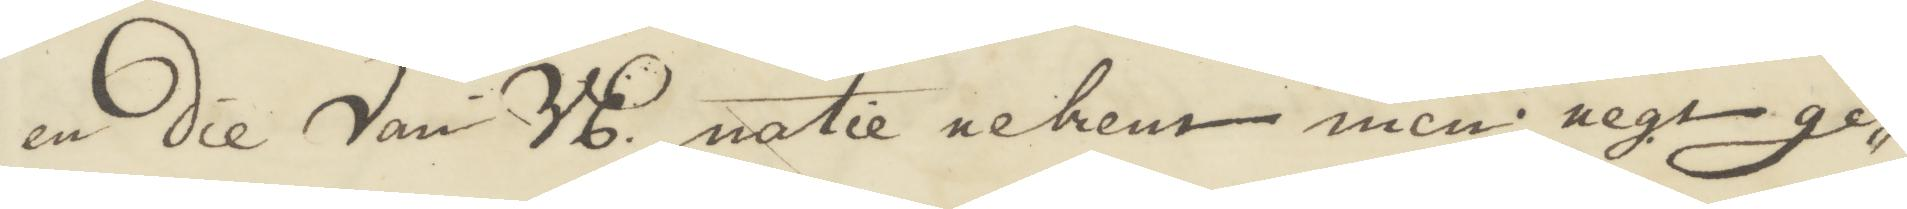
en die van VE. natie rekent men regt ge„
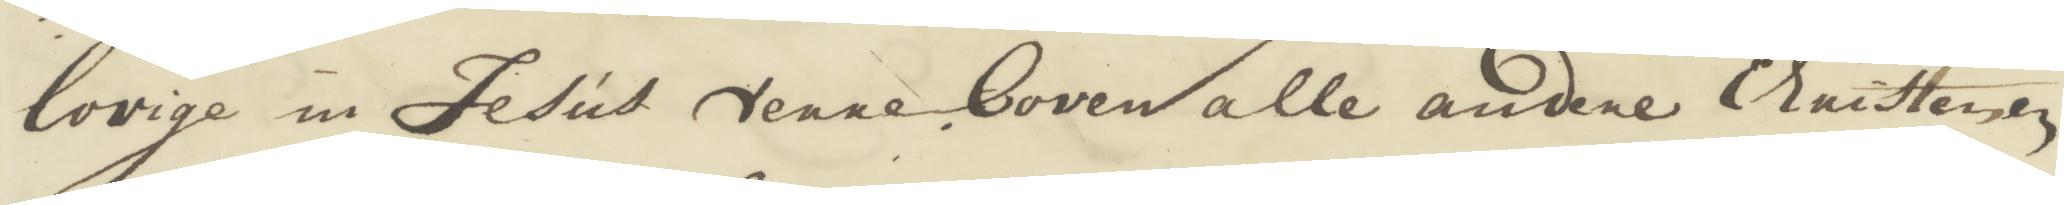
lovige in Iesus verre boven alle andere Christenen
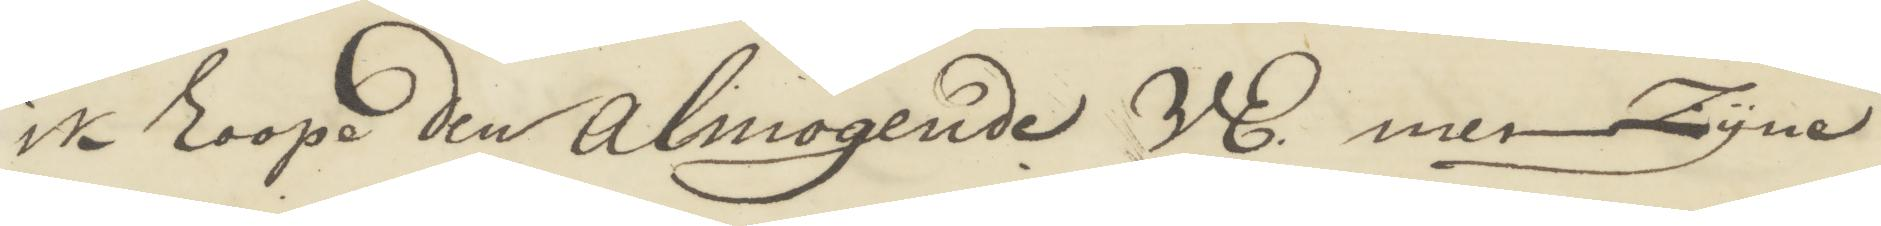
ik hoope den almogende VE. met zijne
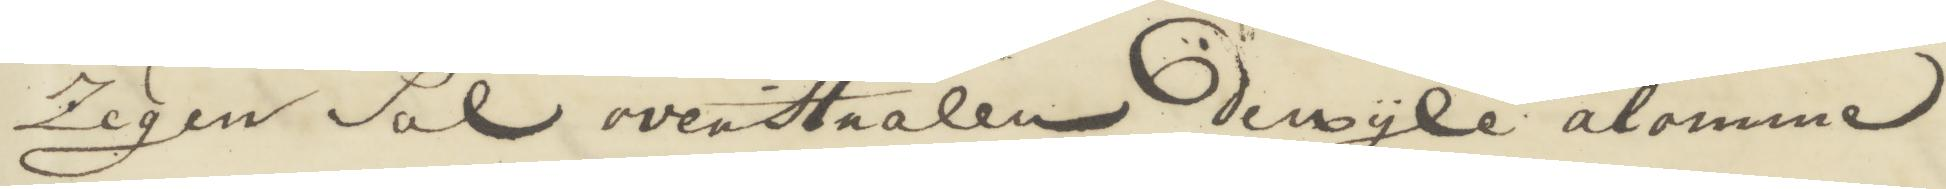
zegen sal overstralen dewijle alomme
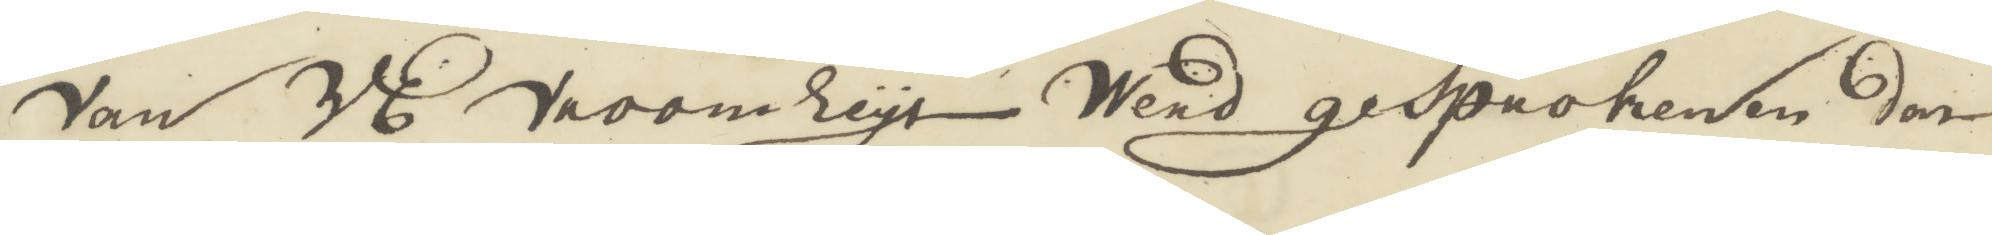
van VE vroomheijt werd gesproken en dat
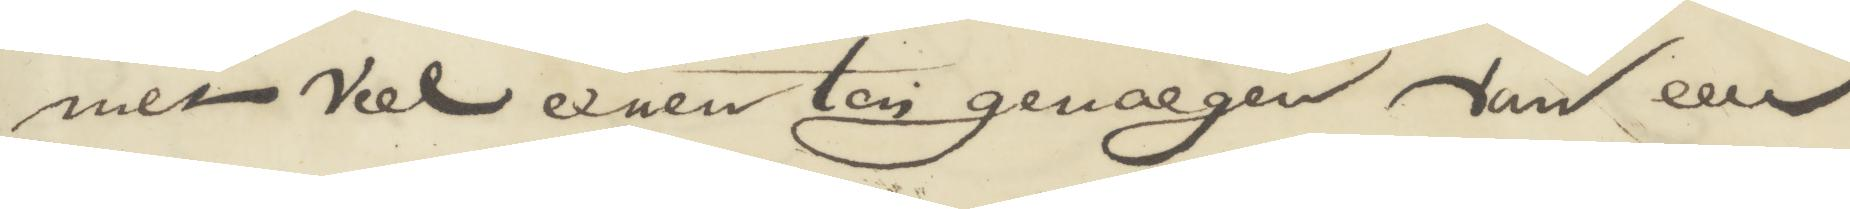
met veel eer en ten genoegen van een
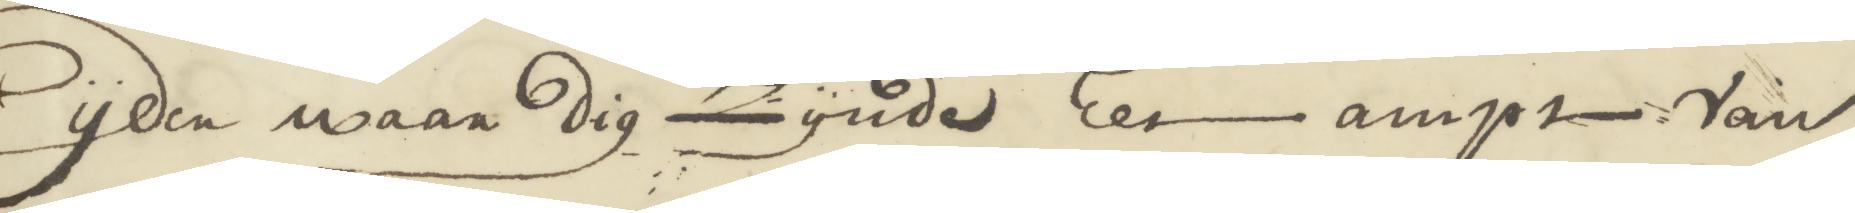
ijder waar dig zijnde het ampt van
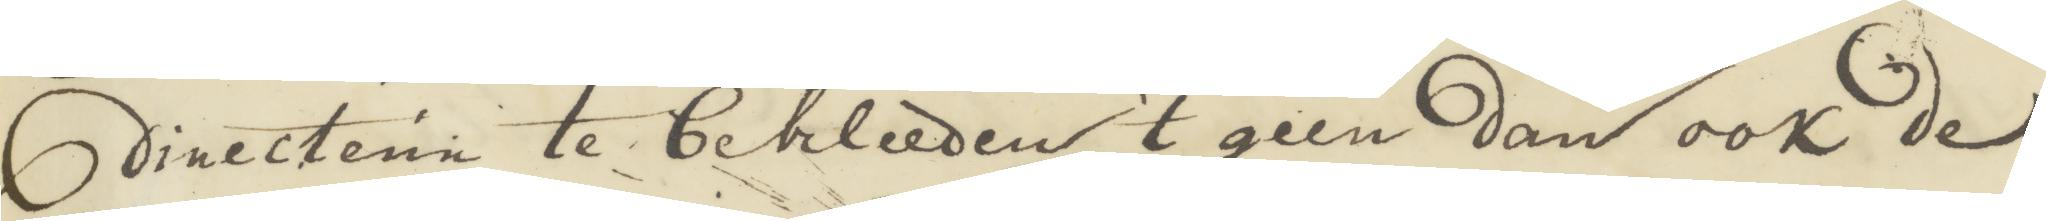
directeur te bekleeden ’t geen dan ook de
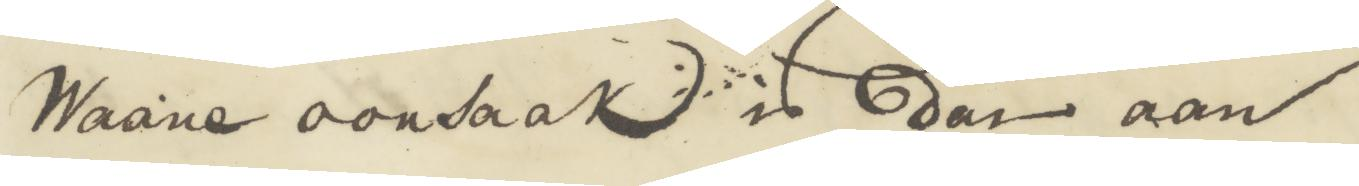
waare oorsaak is dat aan VE per dese
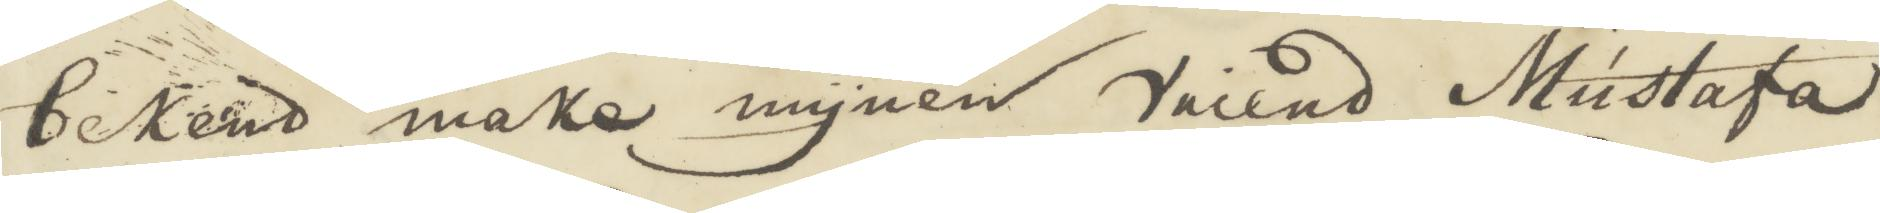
bekend make mijnen vriend Mustafa
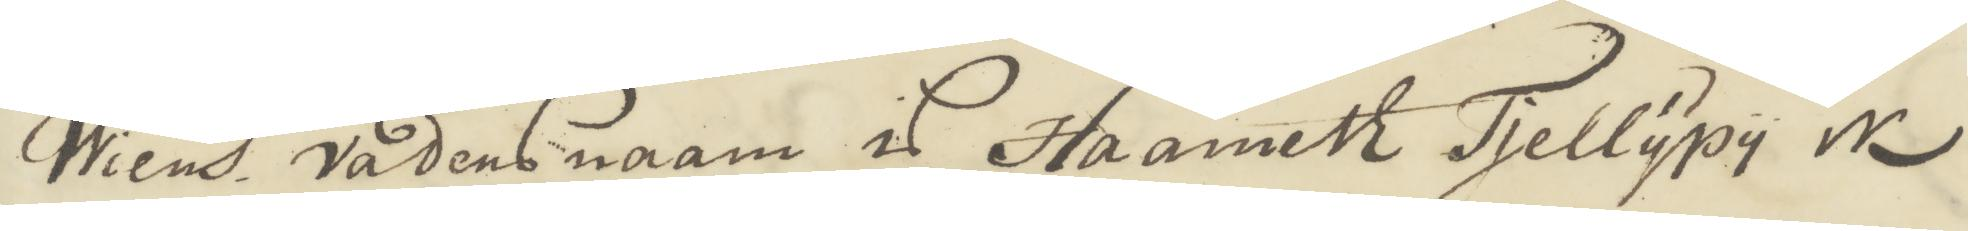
wiens vaders naam is Haameth Tjellijpij ik
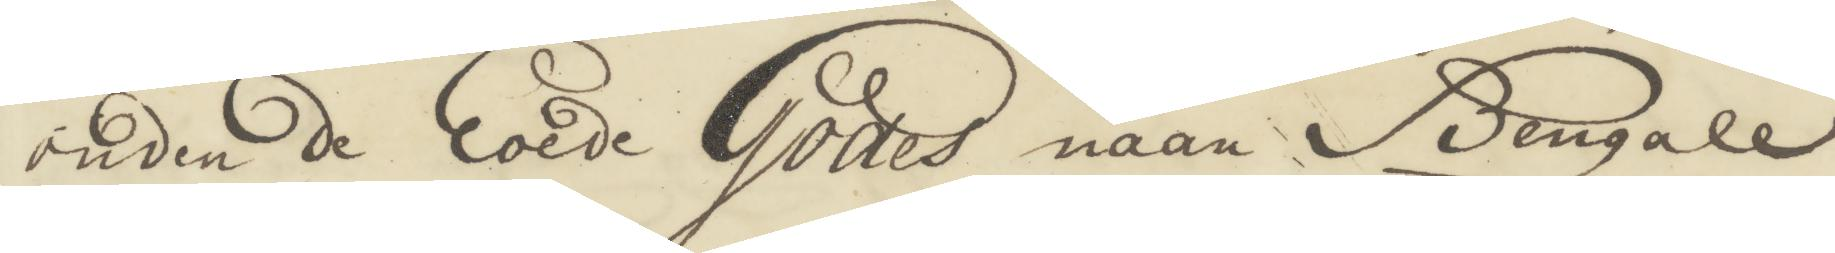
onder de hoede Godes naar Bengale
